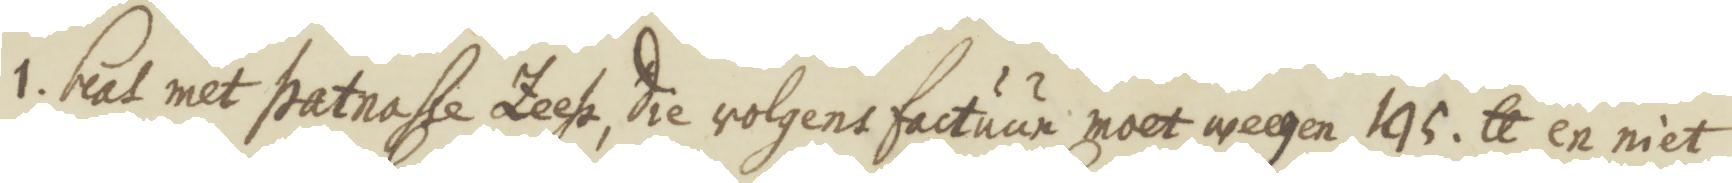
1. kas met patrasse zeep, die volgens factuur moet wegen 145. lb en niet
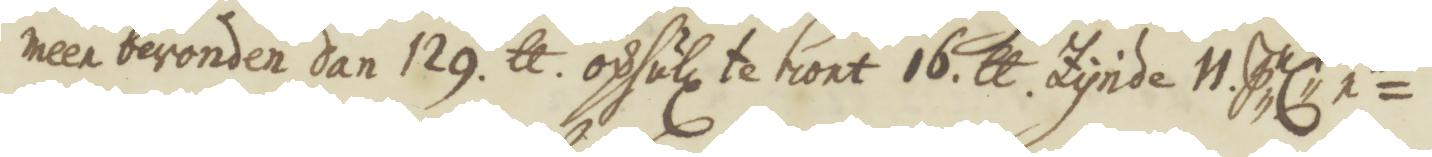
meer bevonden dan 129 lb. oversulx te kort 16. lb. zijnde 11. p„r C„t r=m
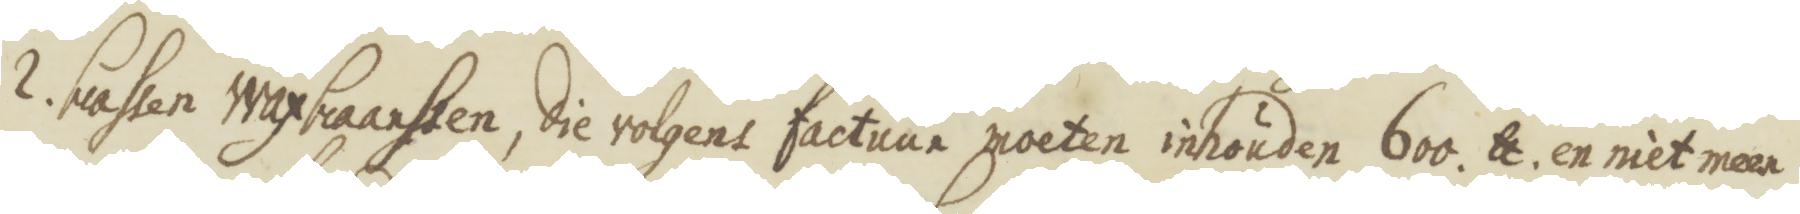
2. kassen waxkaarssen, die volgens factuur moeten inhouden 600. lb. en niet meer
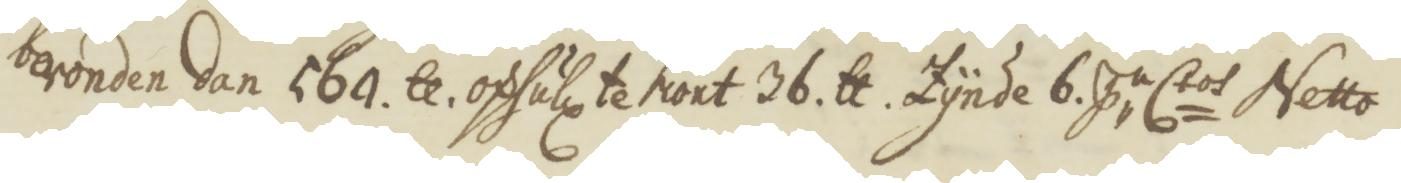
bevonden dan 564. lb. ovesulx te kort 36. lb. zijnde 6. p„r C=tos Netto
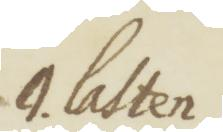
4. lasten
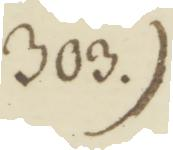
303.)
